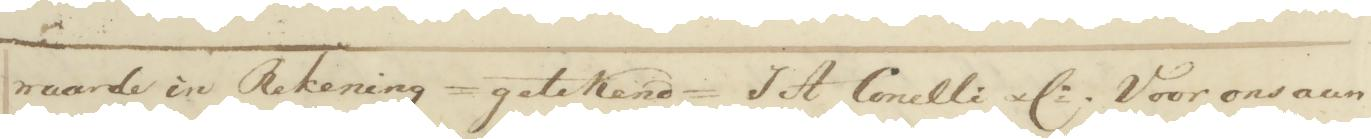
waarde in Rekening = getekend = J A Conelli & C=o. voor ons aan
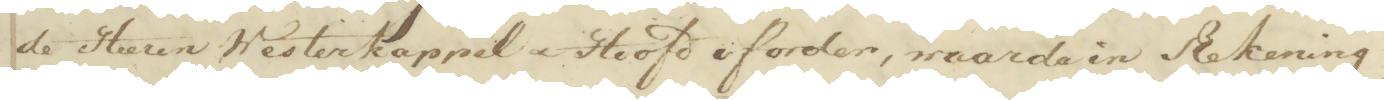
de Heeren Westerkappel & Hoofd of order, waarde in Rekening
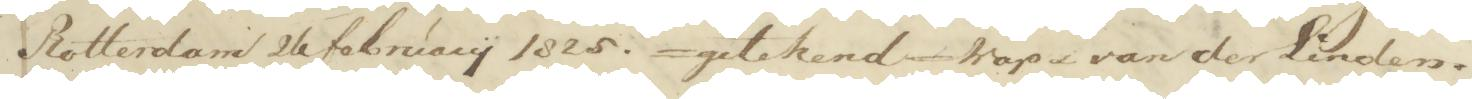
Rotterdam 26 februarij 1825: =getekend Wop & van der Linden.
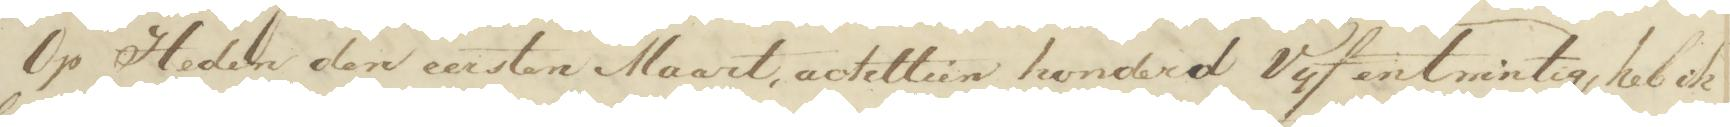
Op Heden den eersten Maart, achttien honderd Vyf entwintig, heb ik
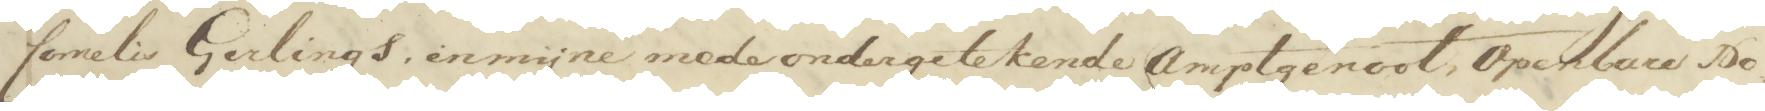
Cornelis Gerlings, en mijne mede ondergetekende Amptgenoot, Openbare No„
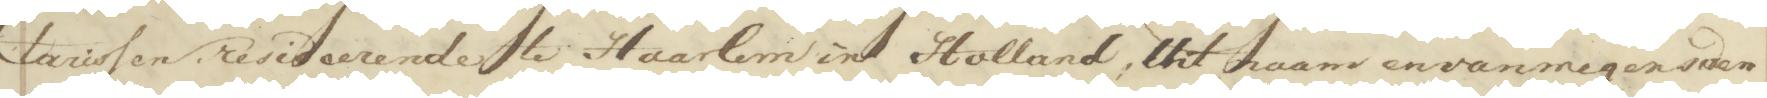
tarissen, resideerende te Haarlem in Holland, uit naam en van wegens den
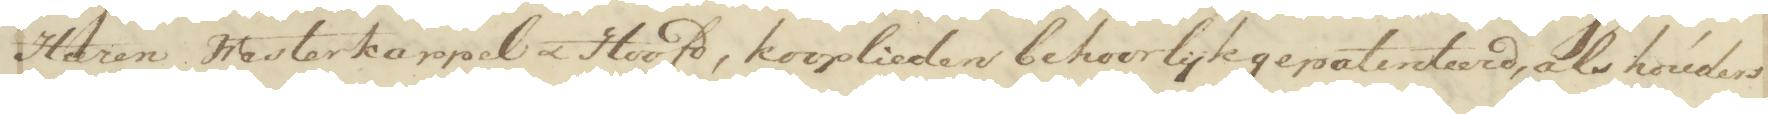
Heeren, Westerkappel & Hoofd, kooplieden behoorlijk gepatenteerd, als houders
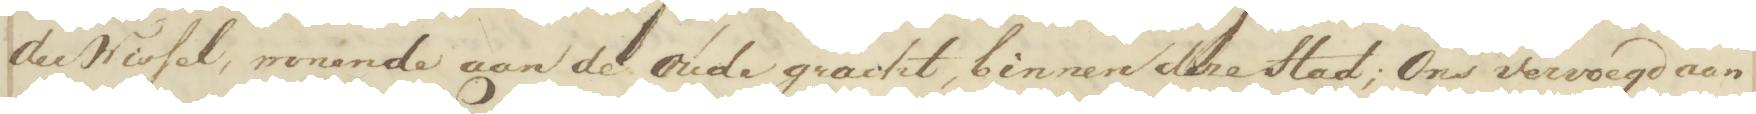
der Wissel, wonende aan de oude gracht, binnen deze stad; Ons vervoegd aan
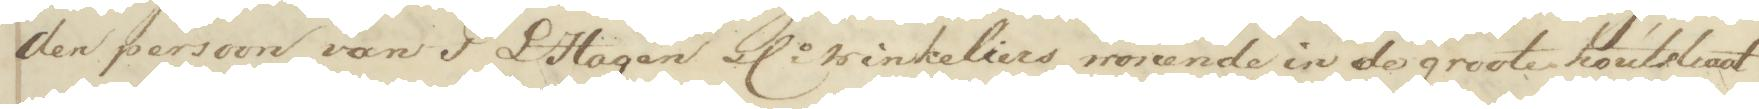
den persoon van P L Hagen & C:o winkeliers wonende in de groote houtstraat
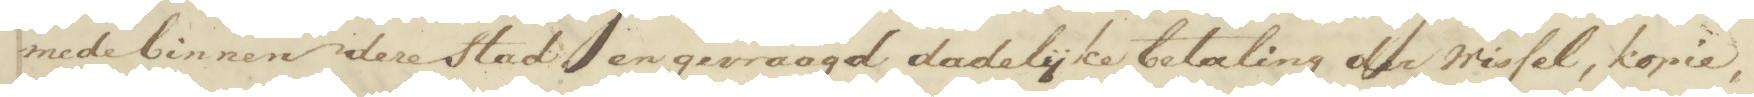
mede binnen deze stad en gevraagd dadelijke betaling der wissel, kopie,
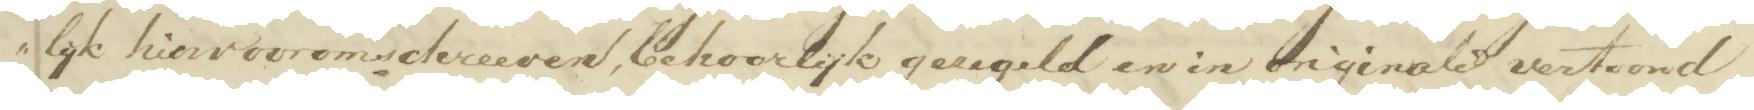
„lijk hiervoor omschreeven, behoorlijk geregeld en in originale vertoond
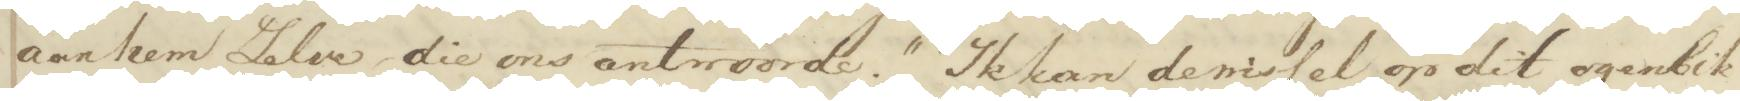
aan hem zelve, die ons antwoorde. "Ik kan de wissel op dit ogenbik
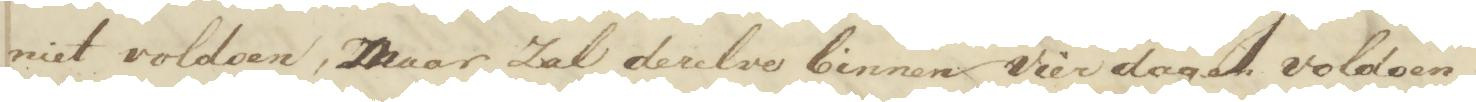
niet voldoen, maar zal dezelve binnen vier dagen voldoen
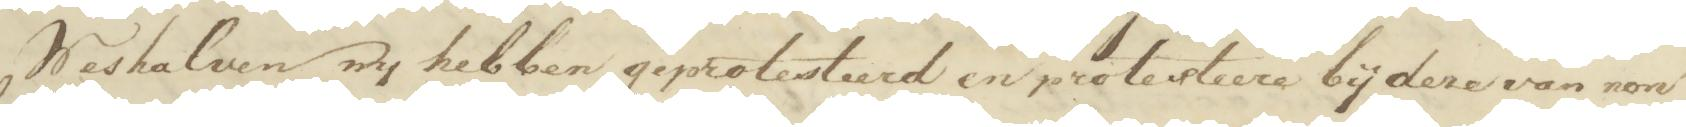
Weshalven wy hebben geprotesteerd en protesteere bij deze van non
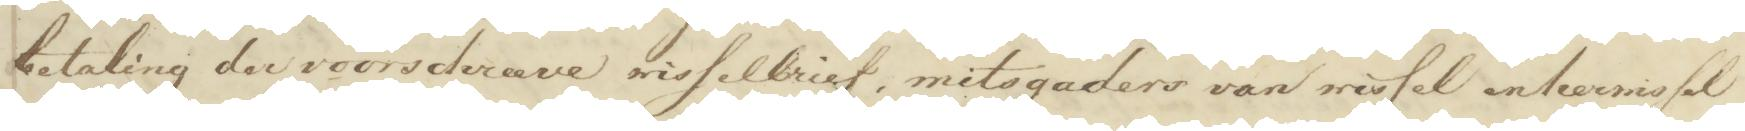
betaling der voorschreeve wisselbrief, mitsgaders van wissel en herwissel
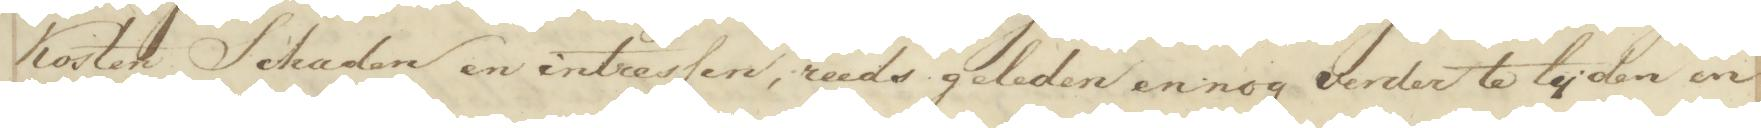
Kosten Schaden en intressen, reeds geleden en nog verder te lijden en
